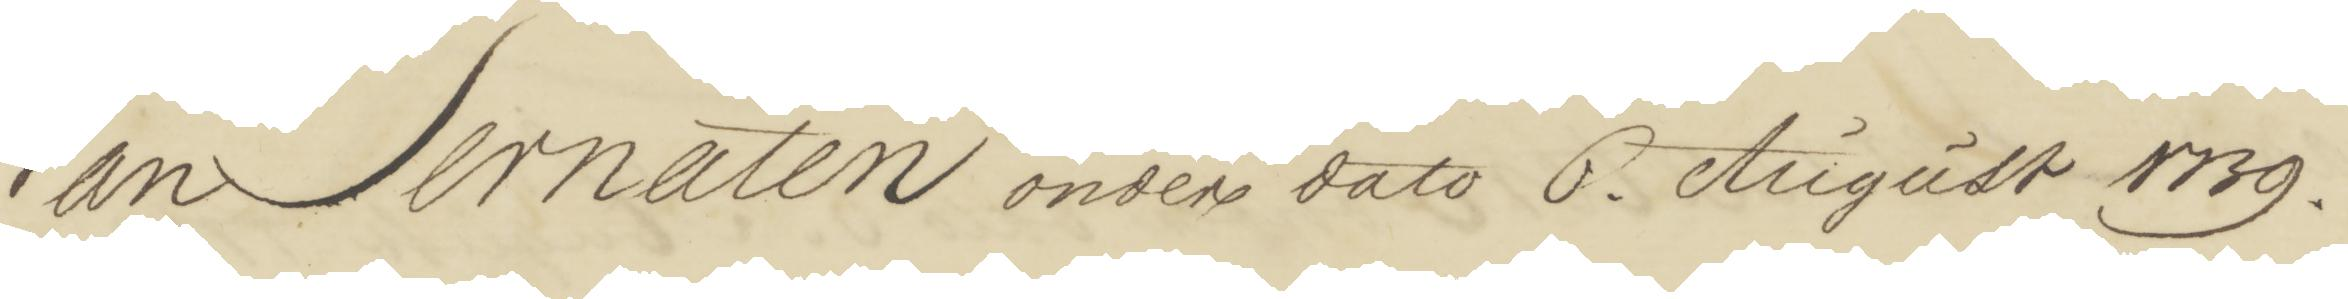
Van Ternaten onder dato 6. August 1739.
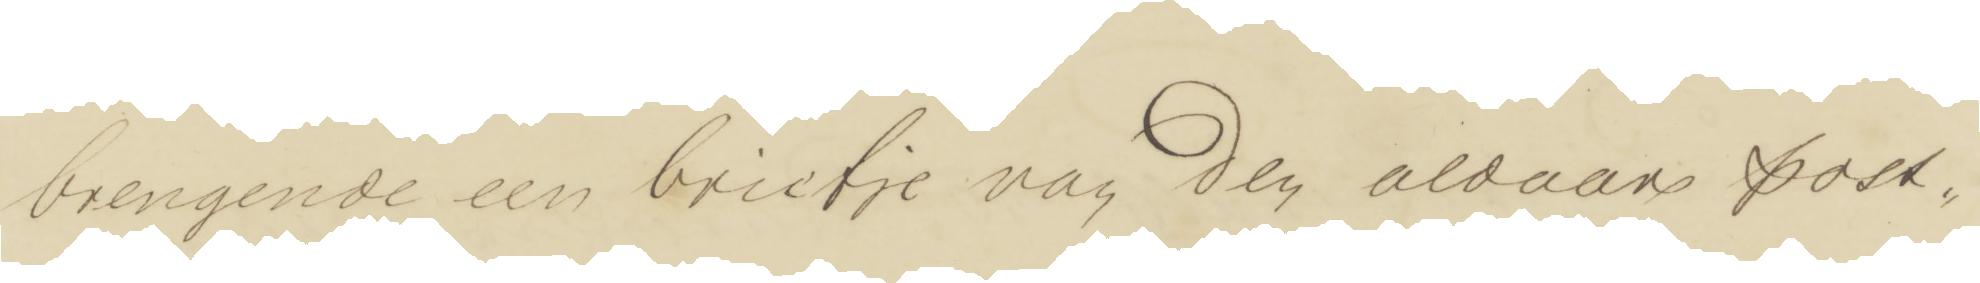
brengende een briefje van den aldaar post„
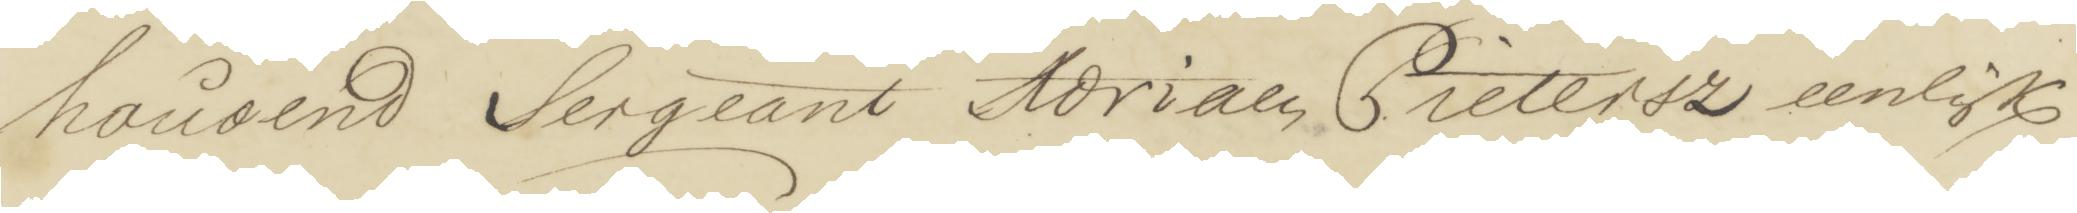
houdend sergeant Adriaen Pietersz eenlijk
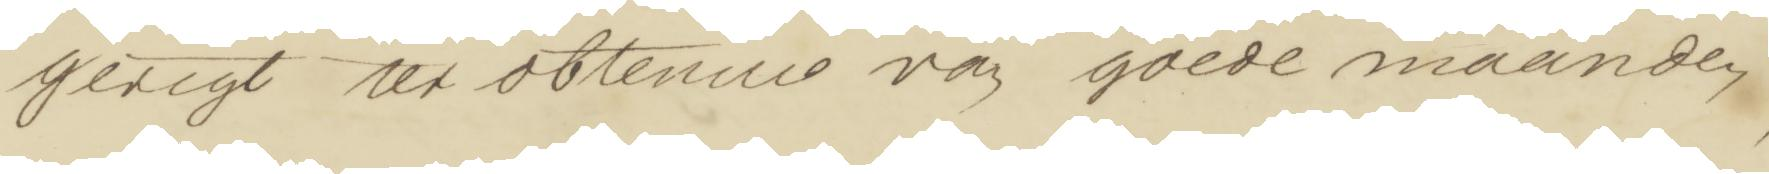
gerigt ter obtenue van goede maanden
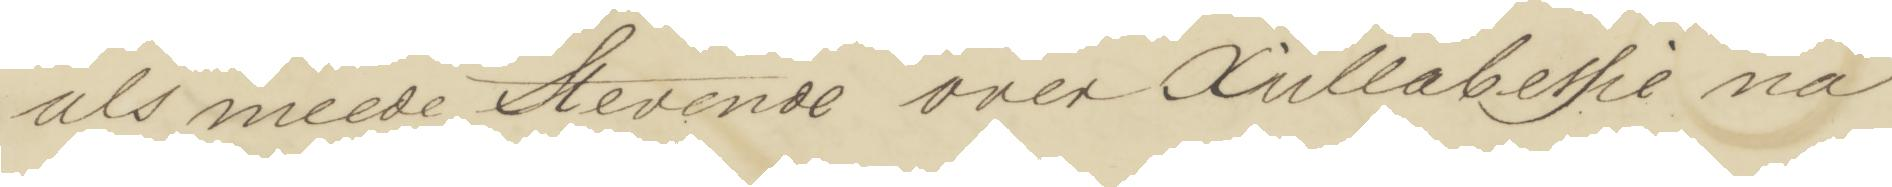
als meede stevende over Xullabessie na
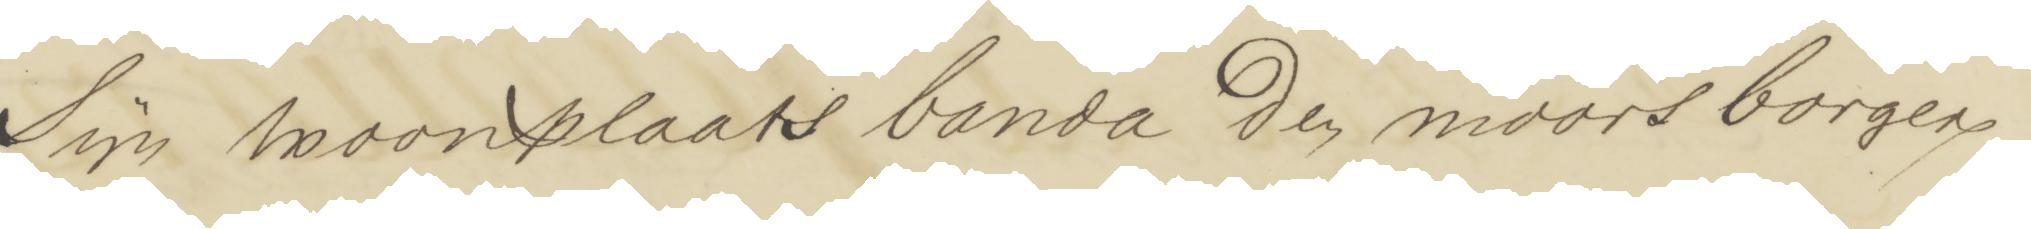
sijn woonplaats banda den moors borger
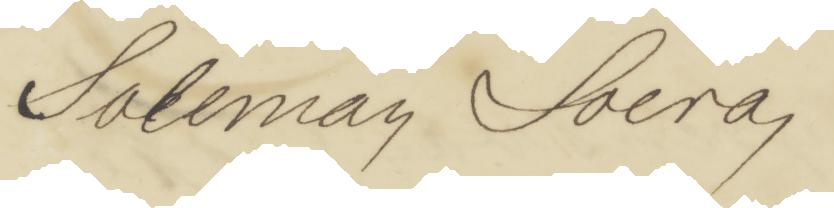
Soleman Soera
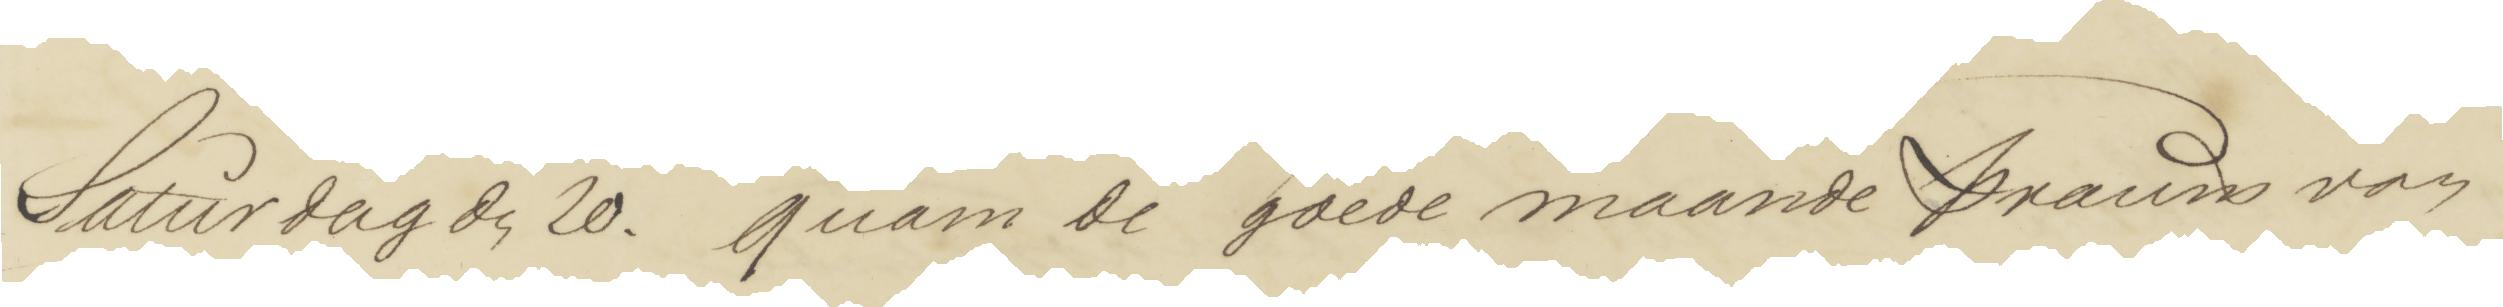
Saturdag den 20. quam de goede maande prauw van
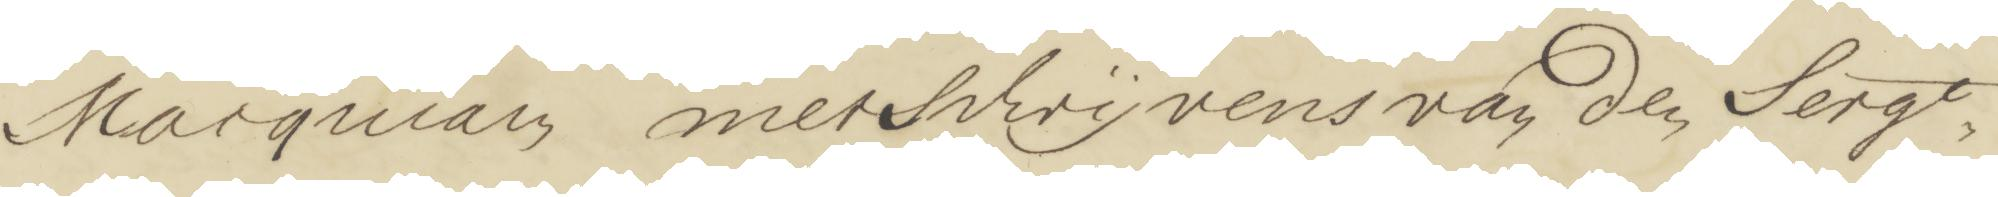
Macquian met schrijvens van den serg„t
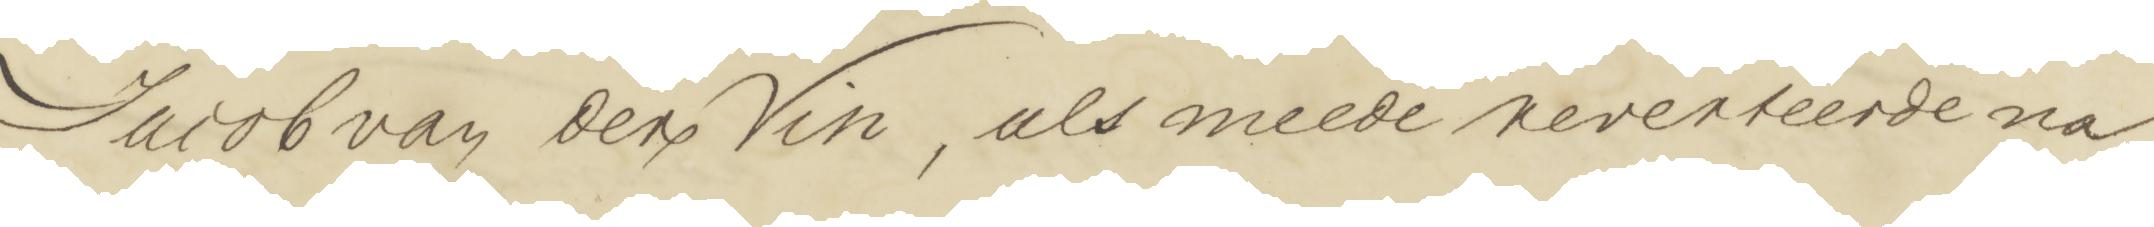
Iacob van der Vin, als meede reverteerde na
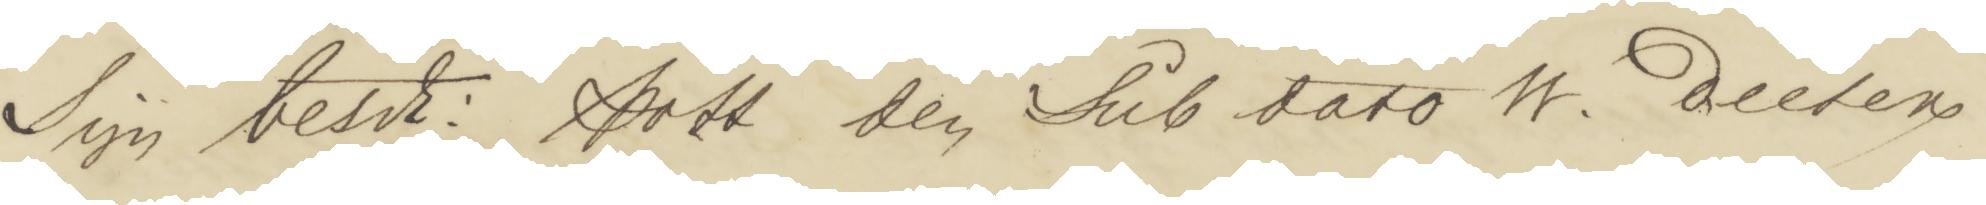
sijn besch: post den sub dato 11. deeser
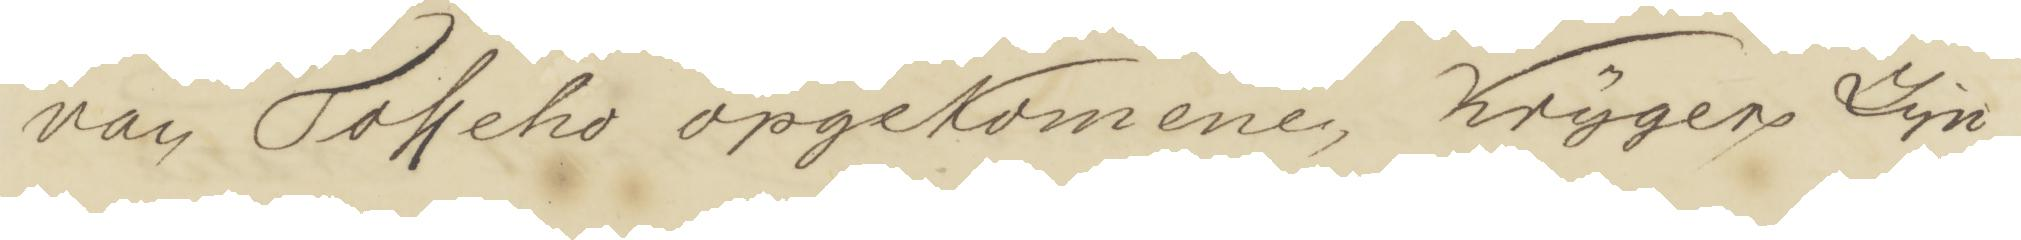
van Tosseho opgekomenen krijger zijn
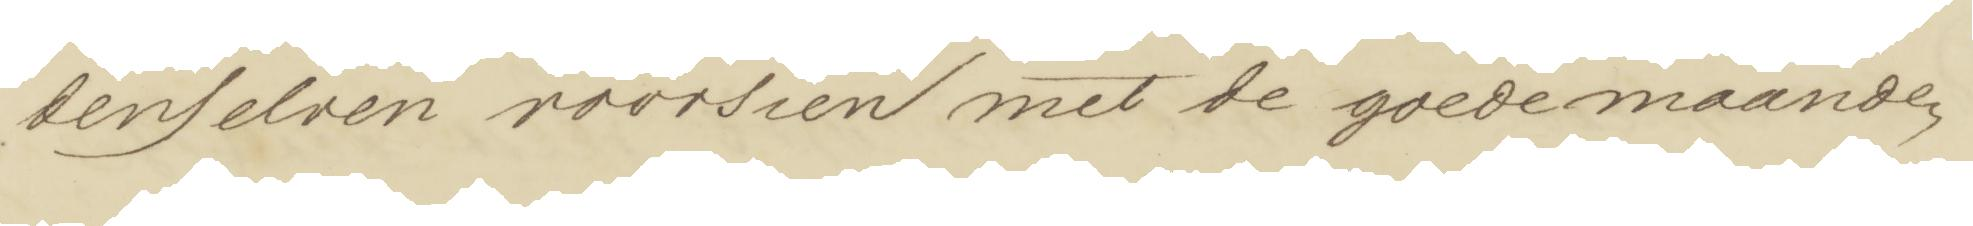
denselven voorsien met de goede maanden
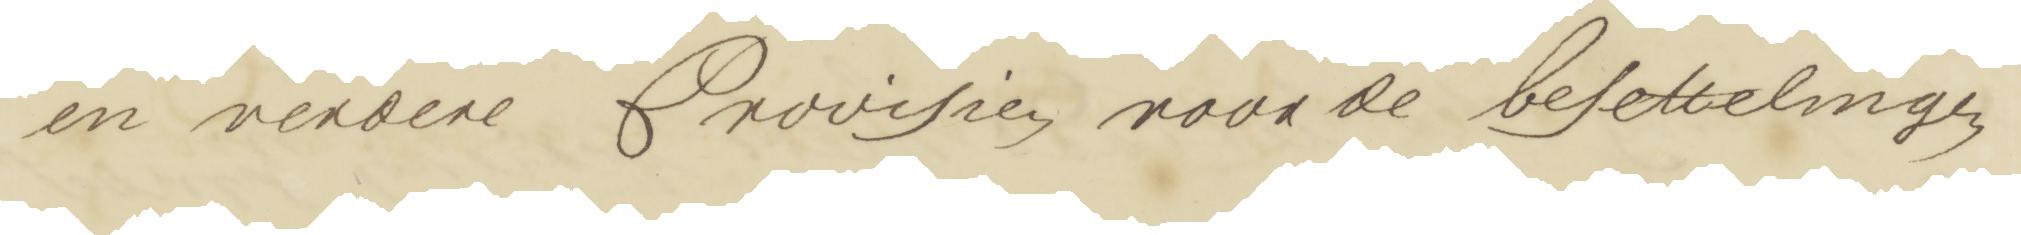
en verdere Provisien voor de besettelingen
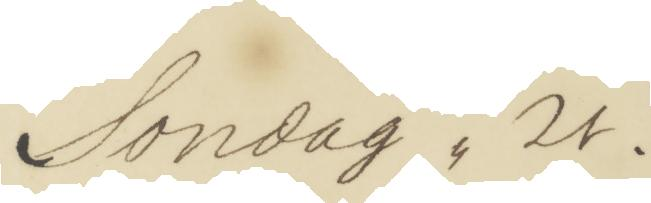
Sondag „ 21
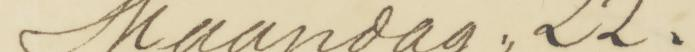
Maandag „ 22.
